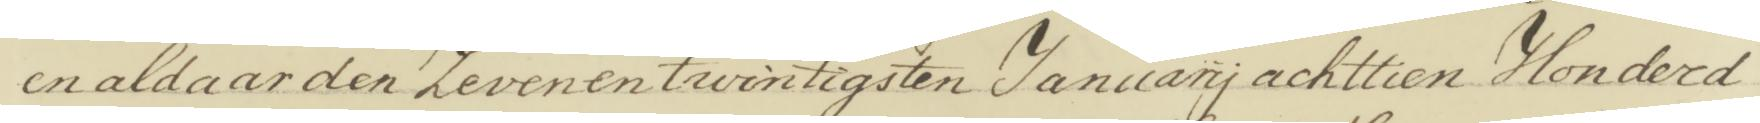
en aldaar den Zevenen twintigsten Ianuarij achttien Honderd
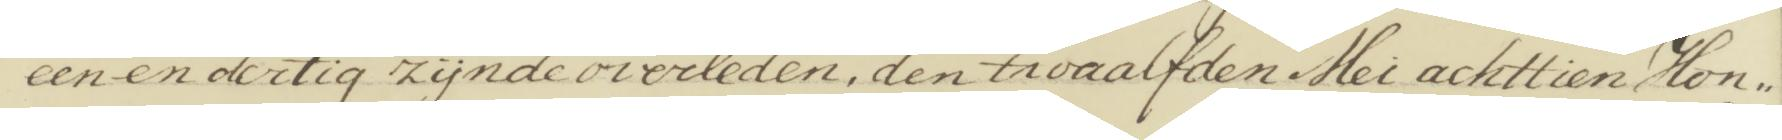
een en dertig zijnde overleden, den twaalfden Mei achttien Hon„
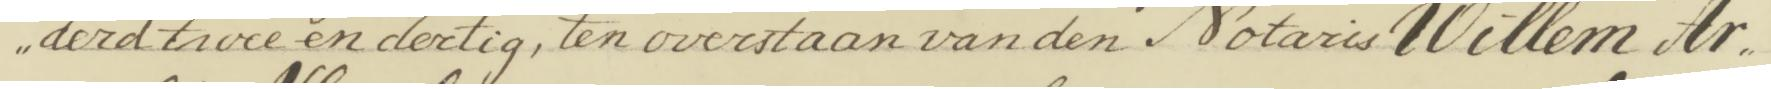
„derd twee en dertig, ten overstaan van den Notaris Willem Ar„
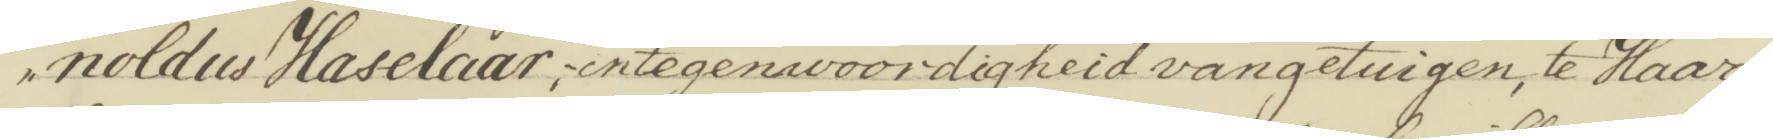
„noldus Haselaar,- integenwoordigheid van getuigen, te Haar
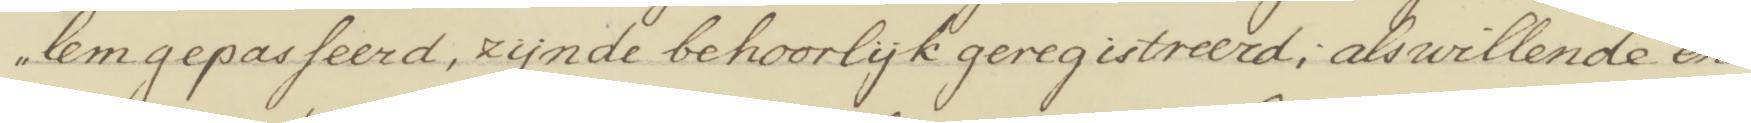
„lem gepasseerd, zijnde behoorlijk geregistreerd; als willende en
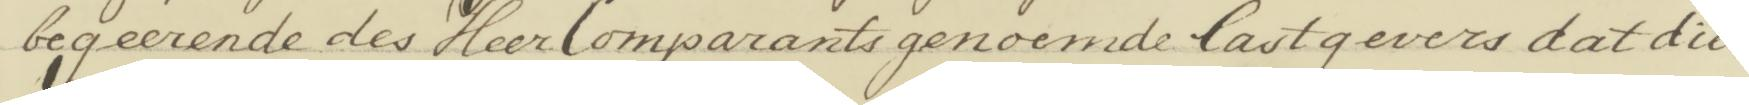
begeerende des Heer Comparant genoemde last gevers dat die
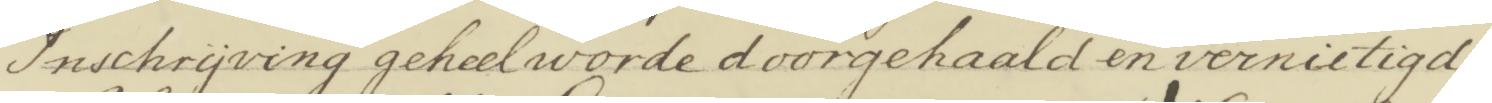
Inschrijving geheel worde doorgehaald en vernietigd.
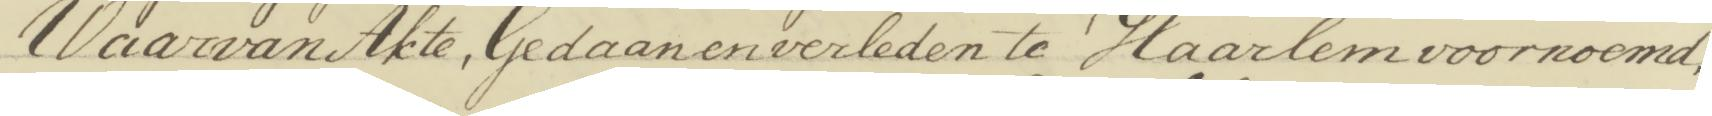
Waarvan Akte, Gedaan en verleden te Haarlem voornoemd,
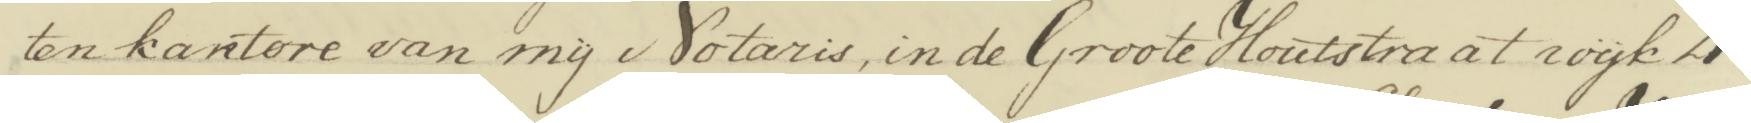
ten kantore van mij Notaris, in de Groote Houtstraat wijk 4
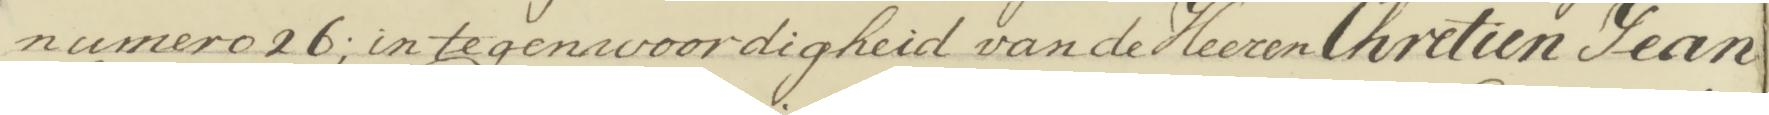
numero 26; in tegenwoordigheid van de Heeren Chretien Iean
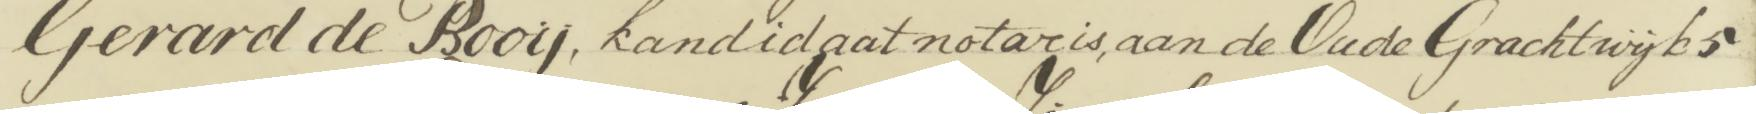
Gerard de Booij, kandidaat notaris, aan de Oude Grachtwijk 5
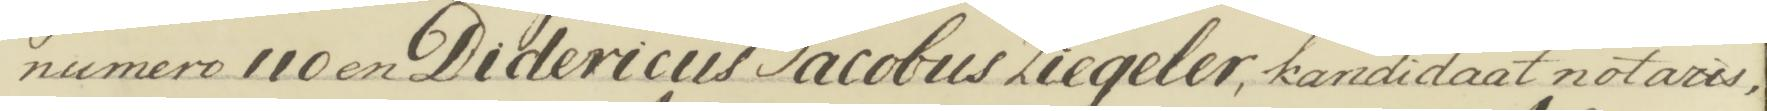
numero 110 en Didericus Iacobus Ziegeler, kandidaat notaris,
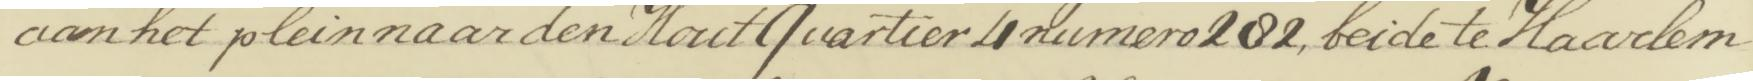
aan het plein naar den Hout Quartier 4 numero 282, beide te Haarlem
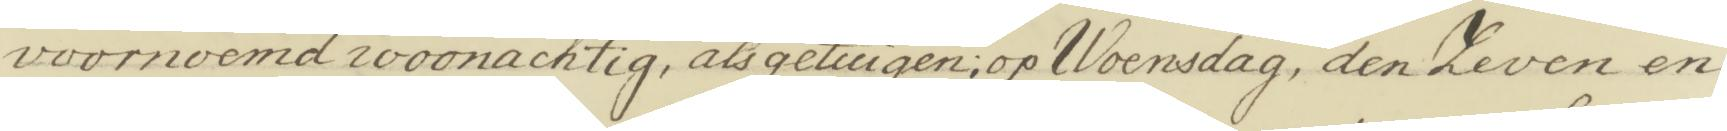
voornoemd woonachtig, als getuigen; op Woensdag, den Zeven en
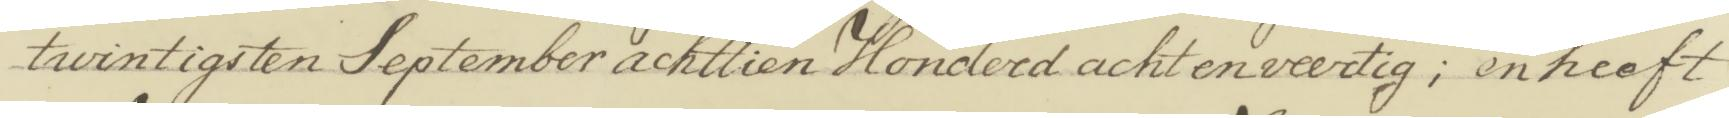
twintigsten September achttien Honderd acht en veertig; en heeft
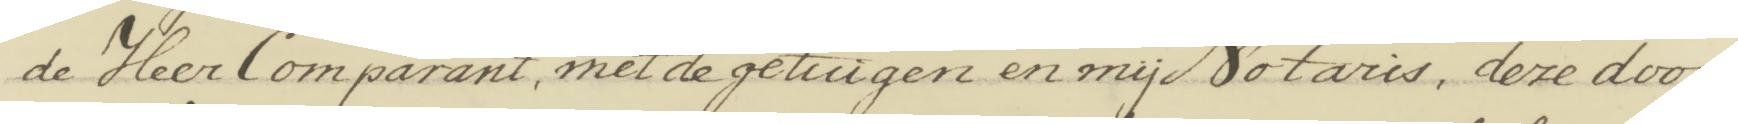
de Heer Comparant met de getuigen en mij Notaris, deze door
